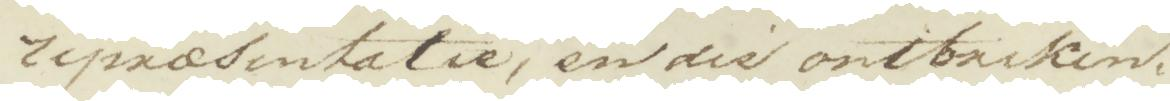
repraesentatie, en die ontbreken,
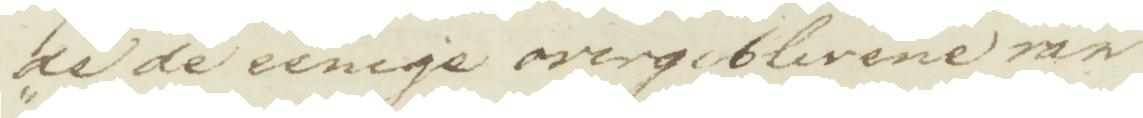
„de de eenige overgeblevene van
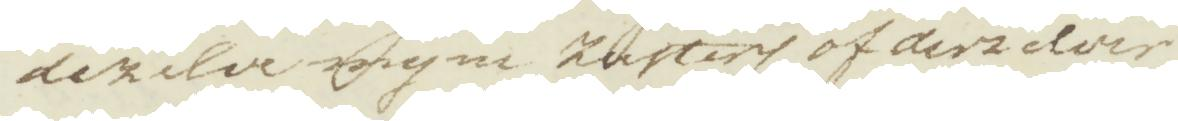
dezelve myne Zusters of derzelver
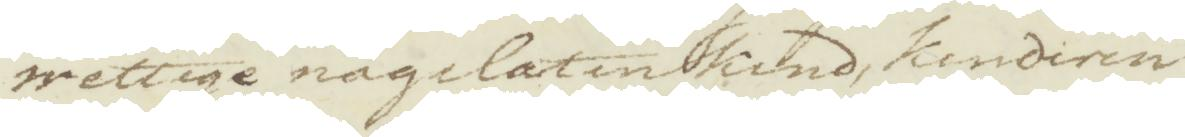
wettige nagelaten kind, kinderen
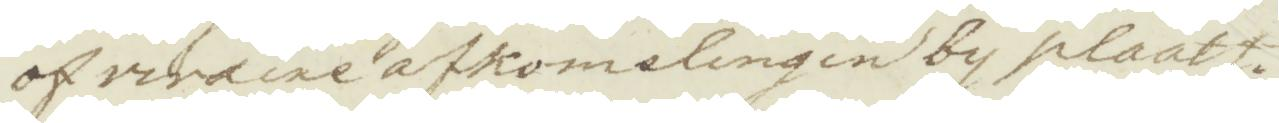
of verdere afkomelingen by plaats.
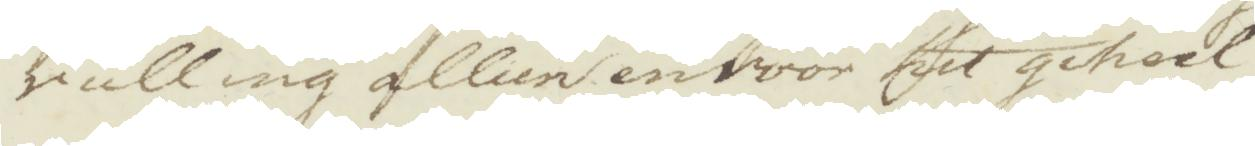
vulling alleen en voor het geheel
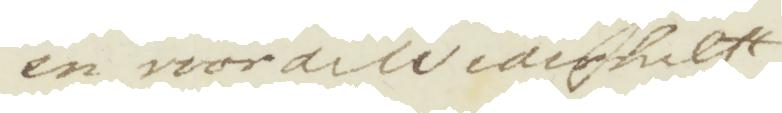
en voor de wederhelft
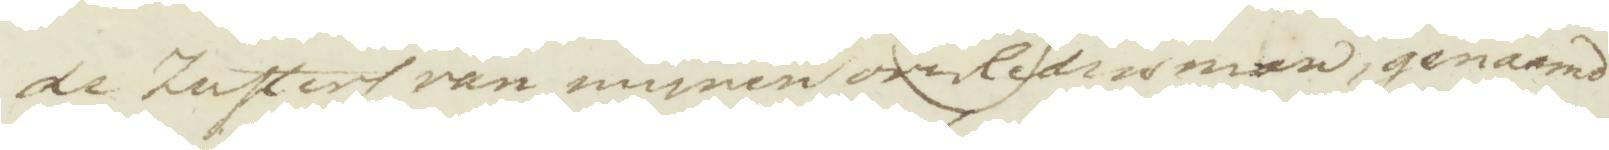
de Zusters van mynen overleden man, genaamd
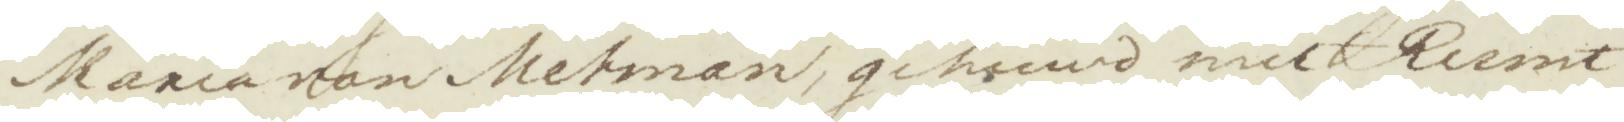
Maria van Metman, gehuwd met Riemt
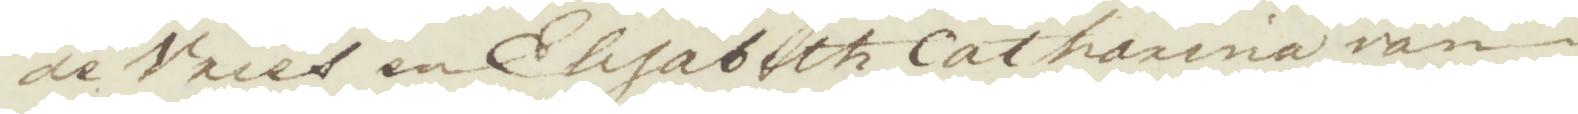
de Vries en Elisabeth Catharina van
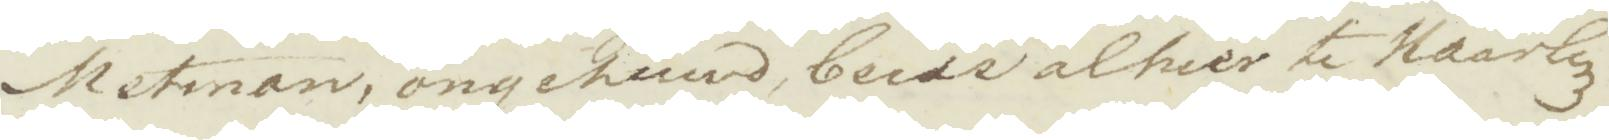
Metman, ongehuwd, beide alhier te Haarlem
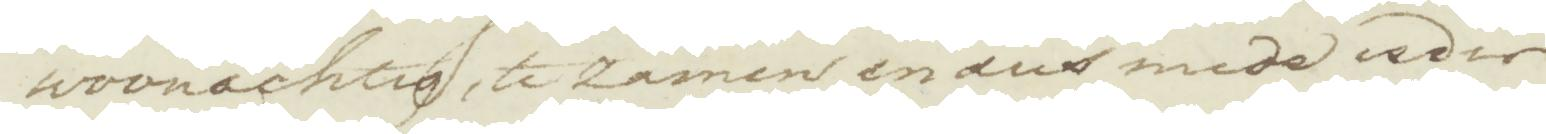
woonachtig, te zamen en dus mede ieder
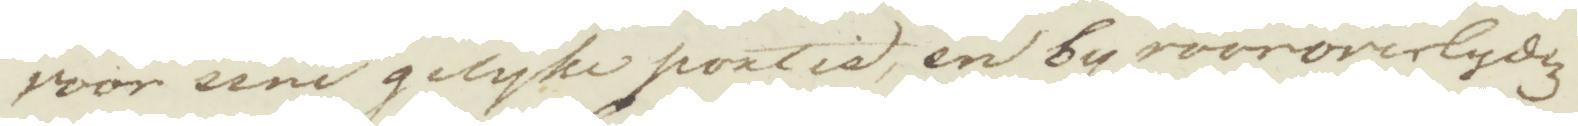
voor eene gelyke portie, en by vooroverlyden
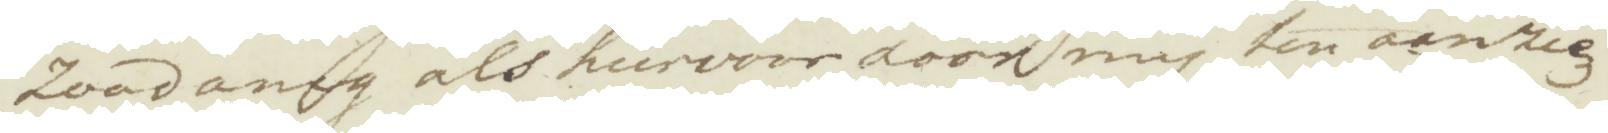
zoodanig als hiervoor door my ten aanzien
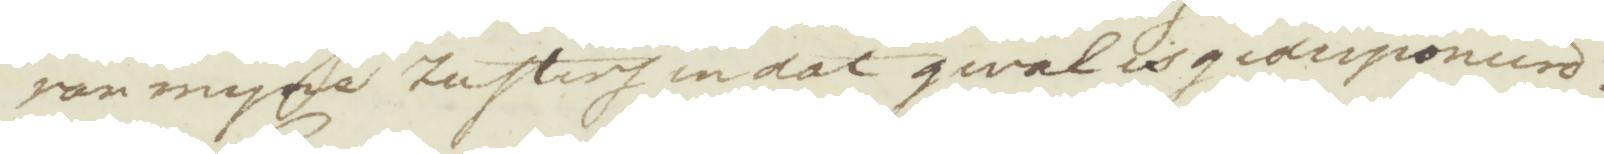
van myne zusters in dat geval is gedisponeerd,
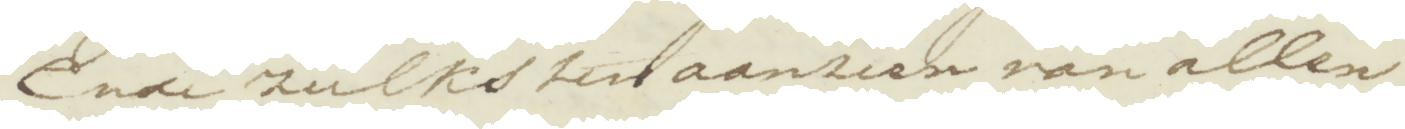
Ende zulks ten aanzien van allen
